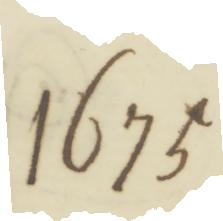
1675
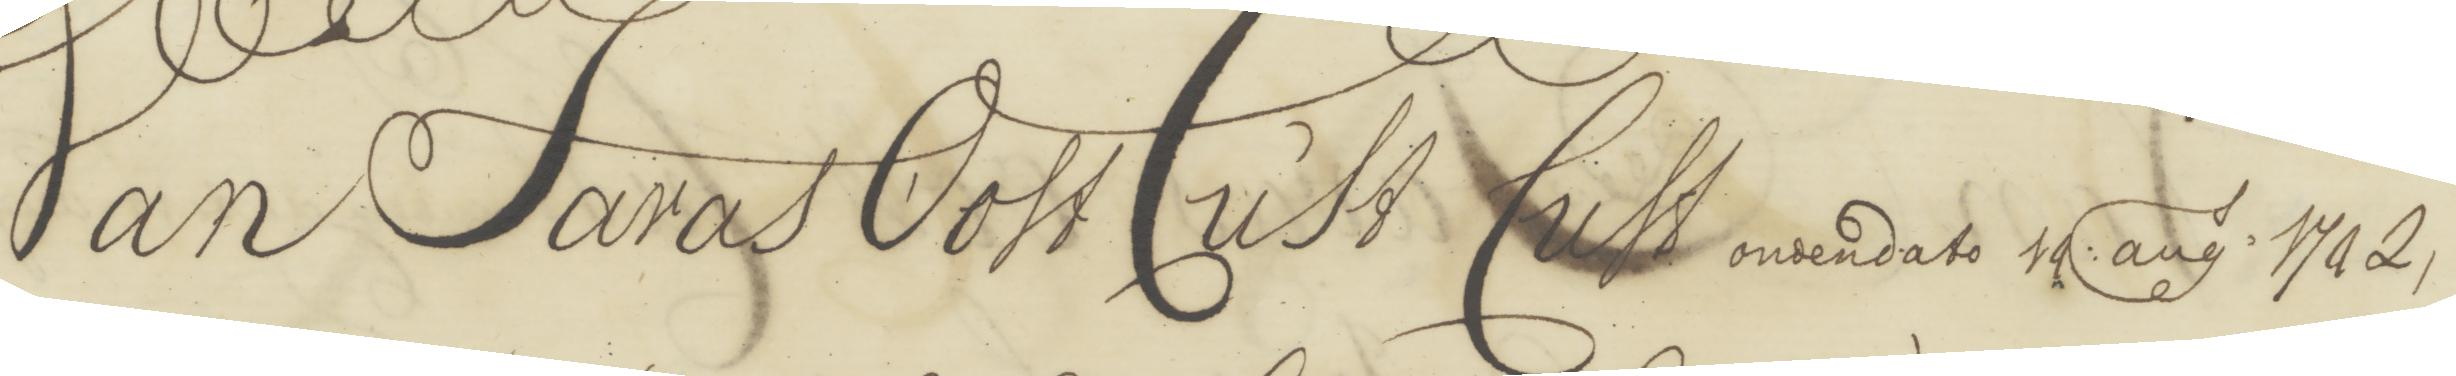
Van Iavas Oost Cust Cust onderdato 14: aug:s 1742,
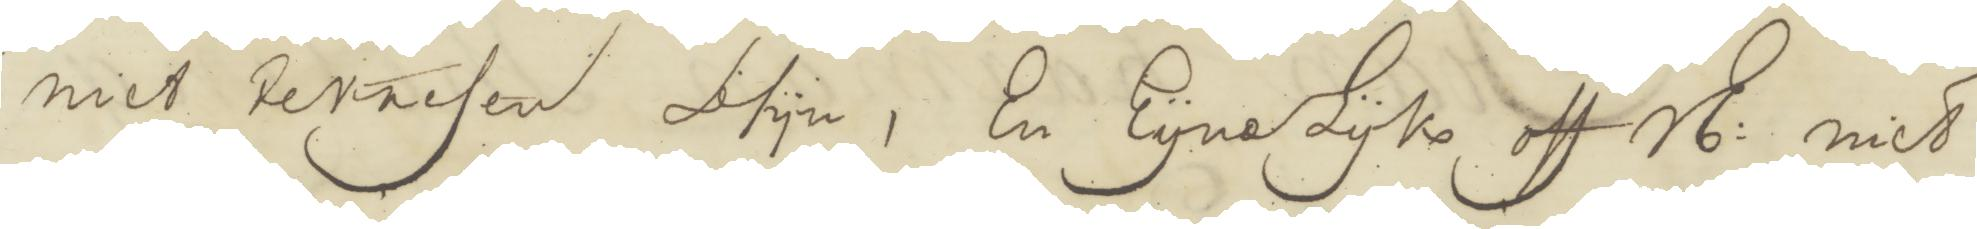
niet tevresen tesijn, En Eijndlijk off VE: niet
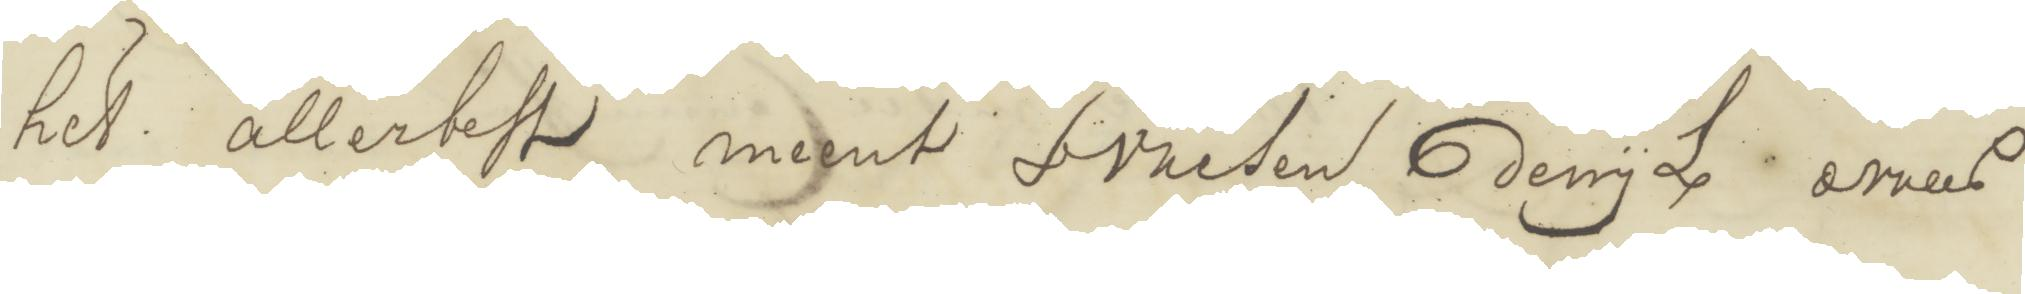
het allerbest meent tevresen dewijl devrees
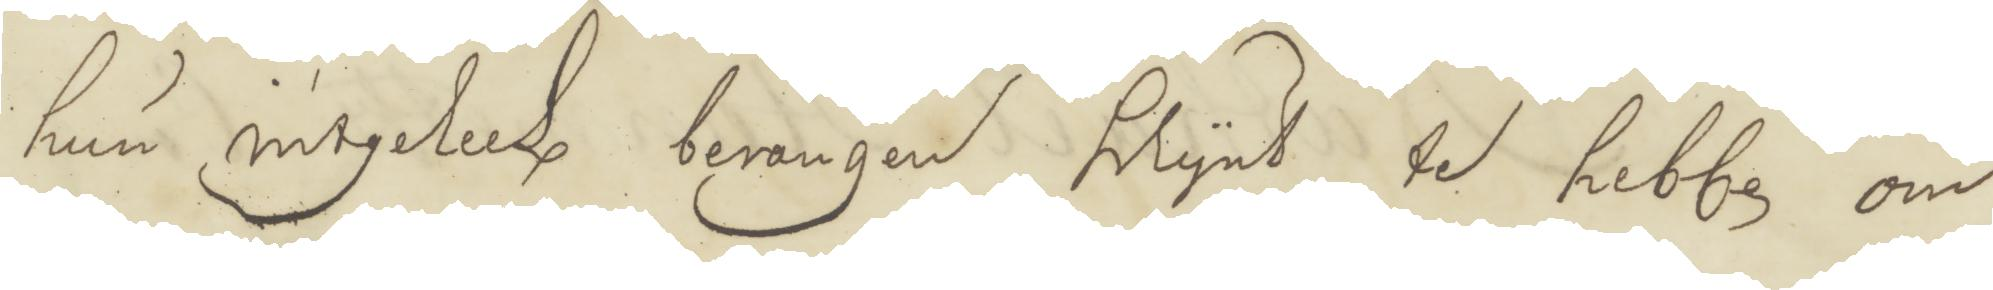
hun in'tgeheel bevangen schijnt te hebben om
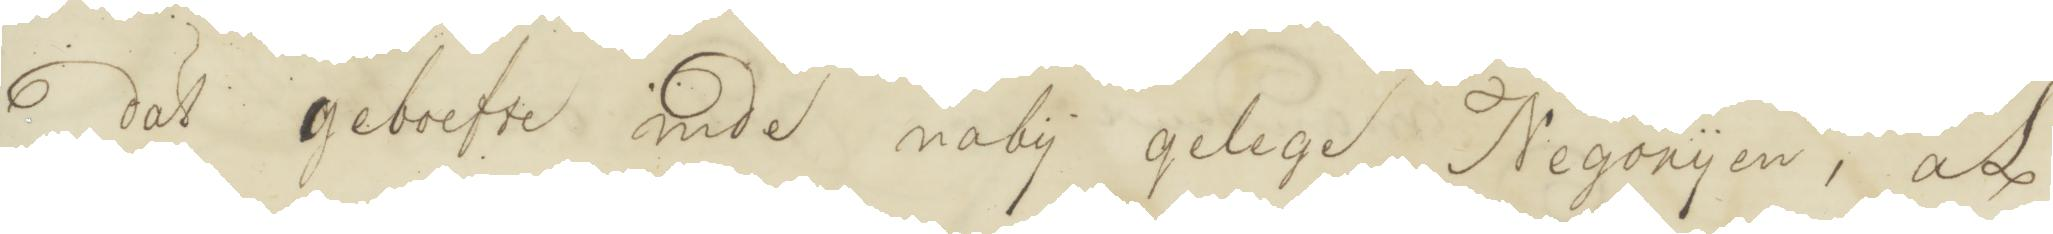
dat geboefte inde nabij gelege Negorijen, al
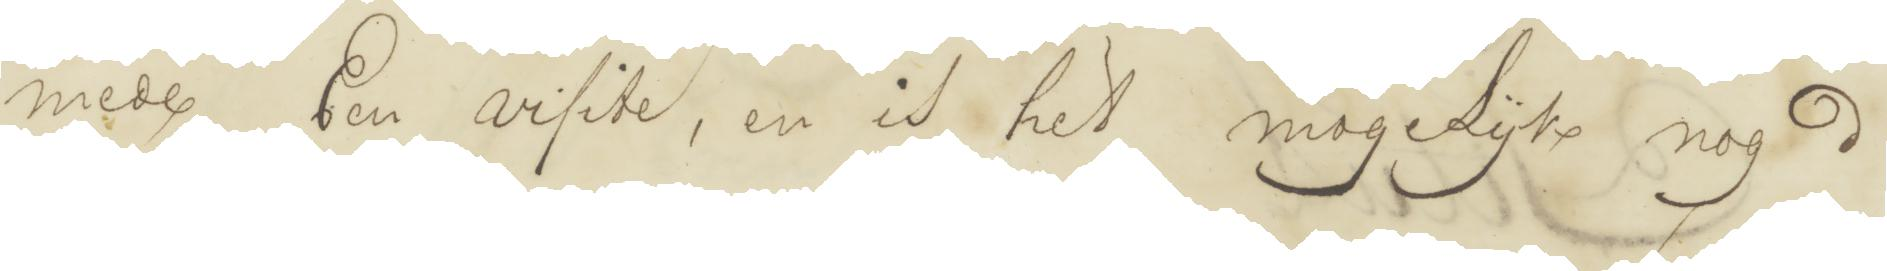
mede Een visite, en is het mogelijk nog d'
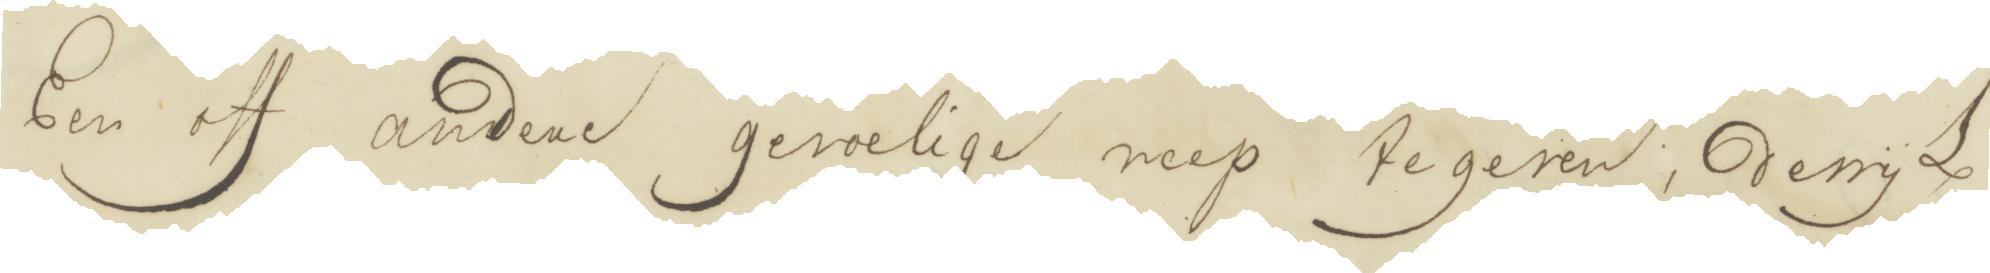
Een off andere gevoelige neep tegeven, dewijl
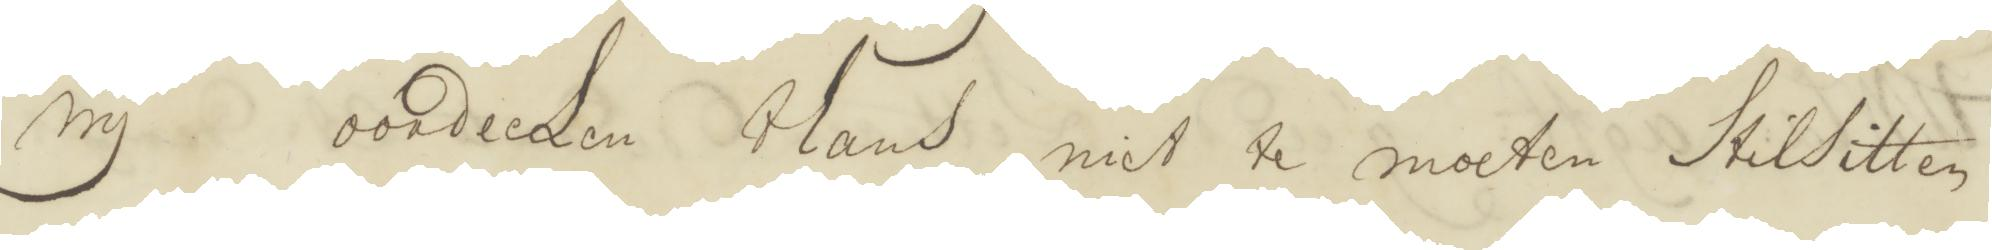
wij oordeelen thans niet te moeten stilsitten
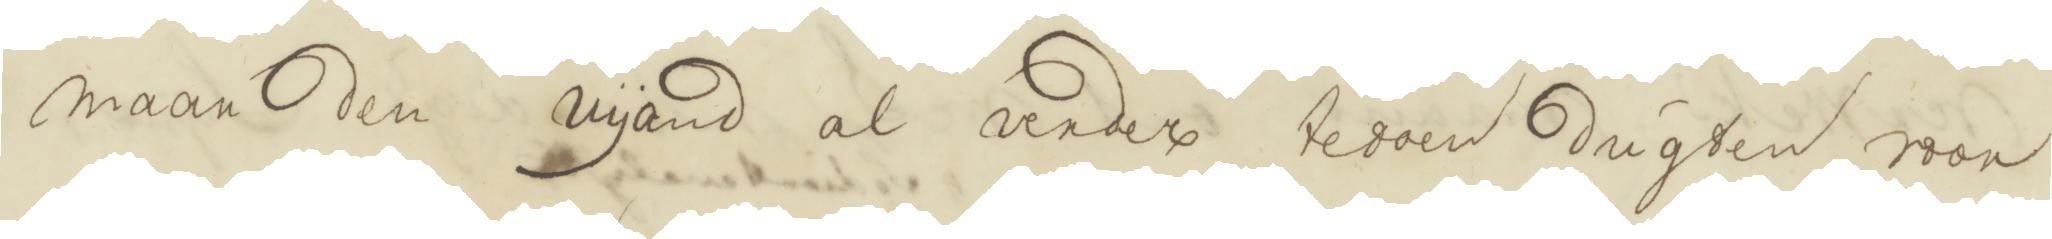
maar den vijand al verder tedoen dugten voor
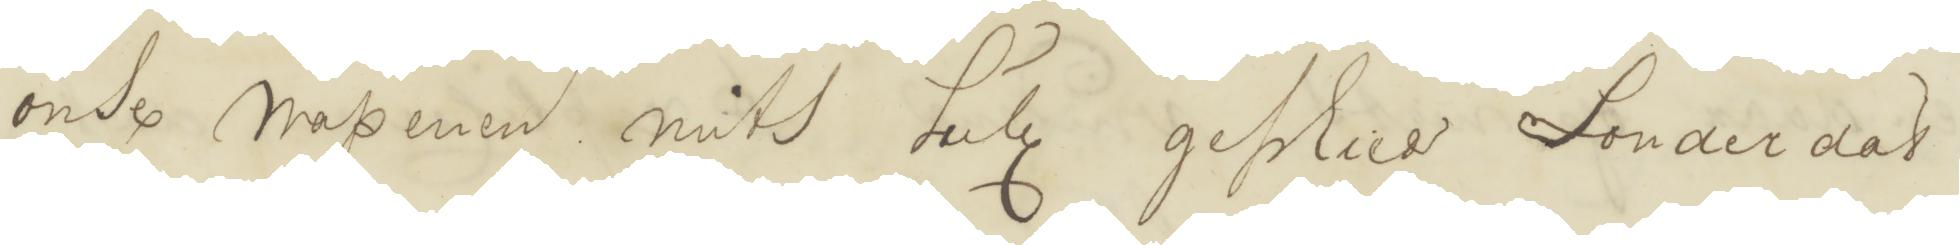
onse wapenen mits sulx geschiede sonder dat
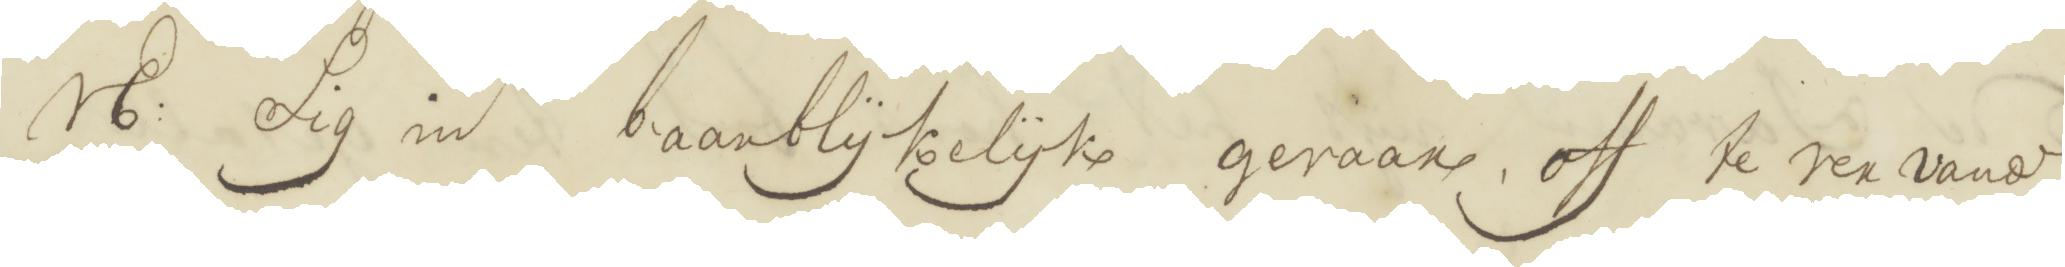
VE: sig in baarblijkelijk gevaar, off te ver vande
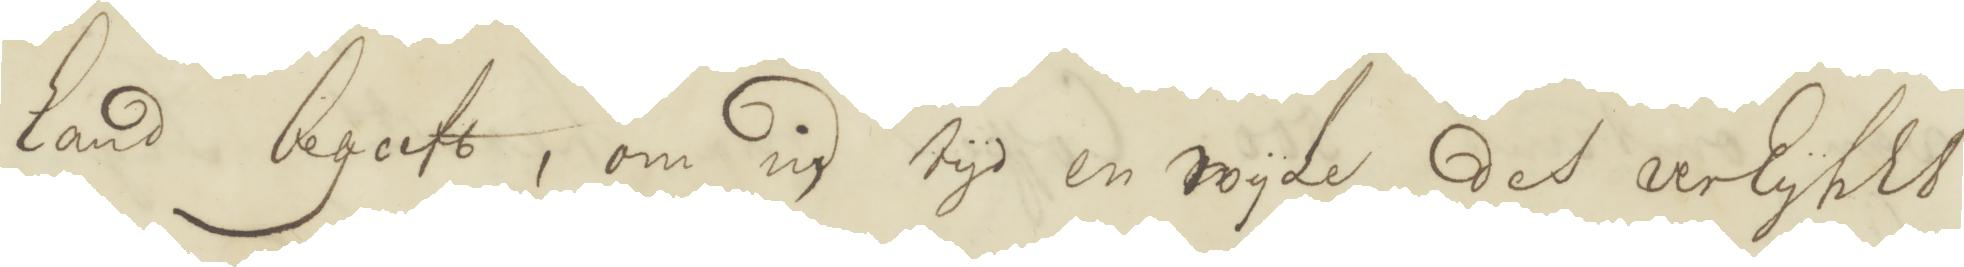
land begeeft, om in tijd en wijle des verEijscht
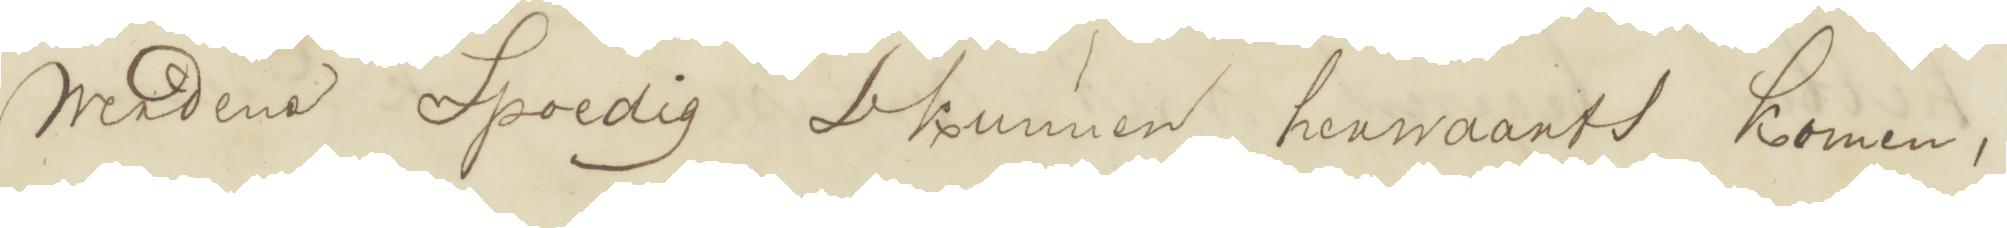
werdene spoedig te kunnen herwaarts komen,
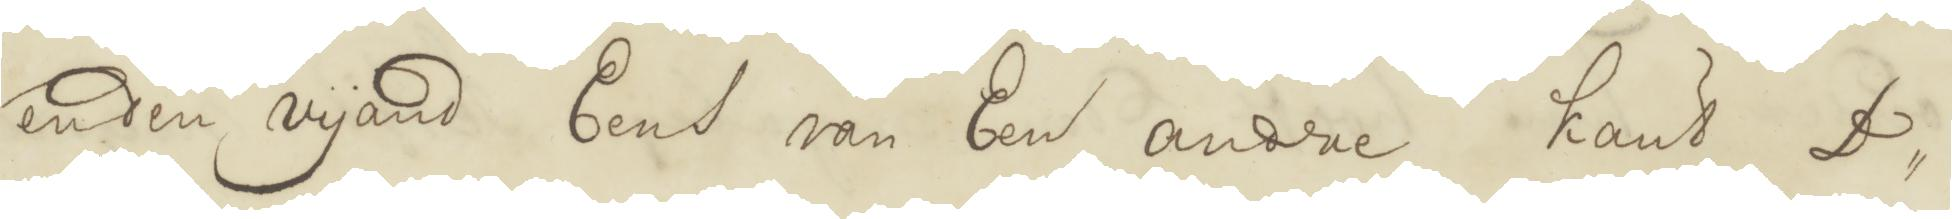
en den vijand Eens van Een andere kant te„
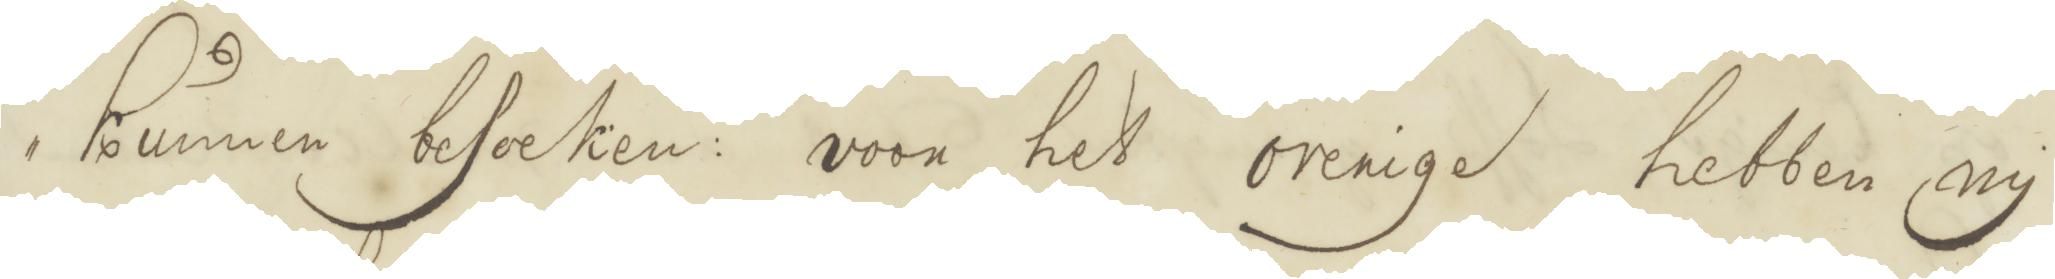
„kunnen besoeken: voor het overige hebben wij
